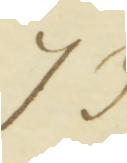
735.
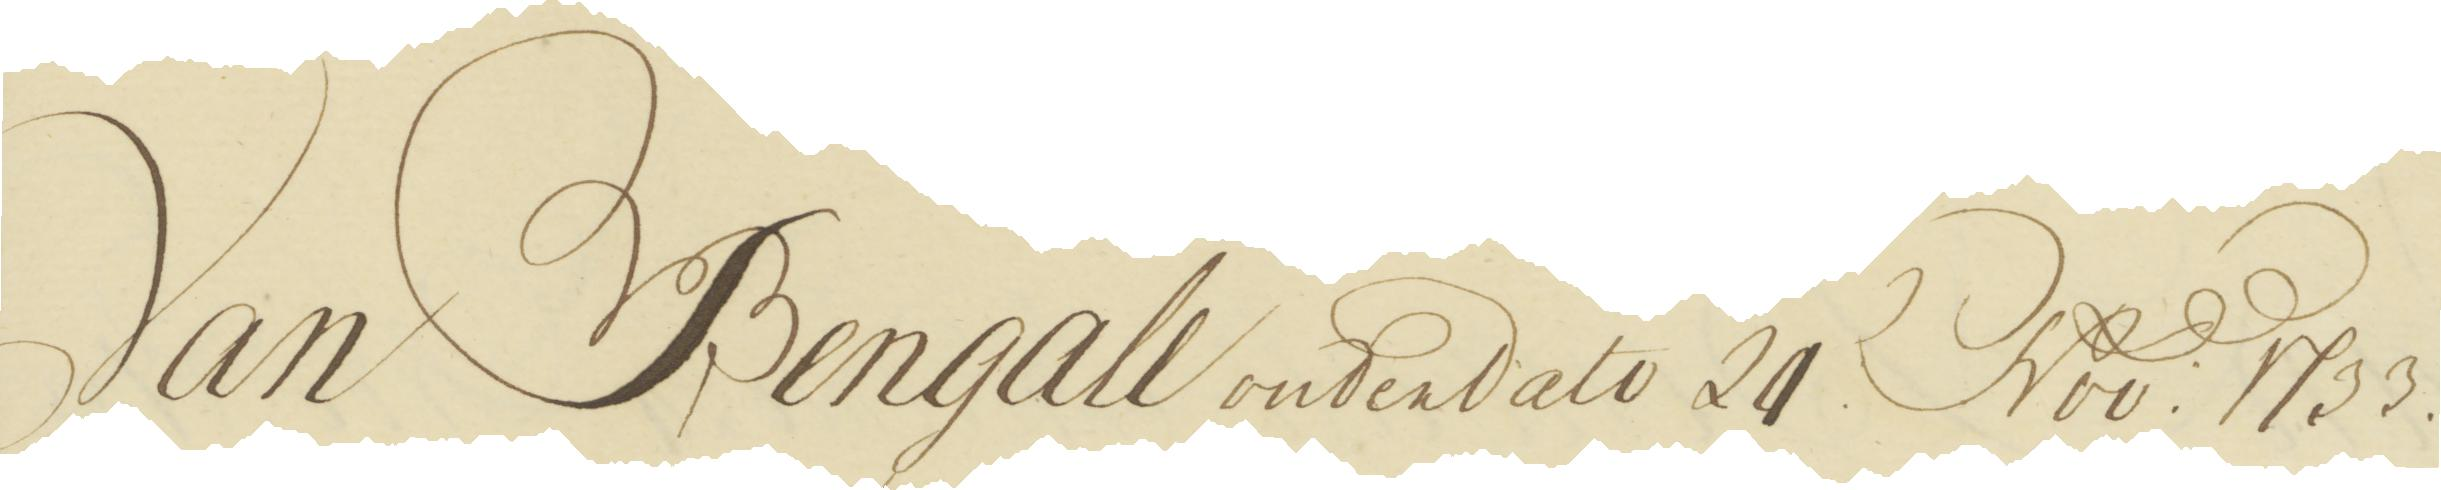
Van Bengale onderdato 24:' Nov: 1733.
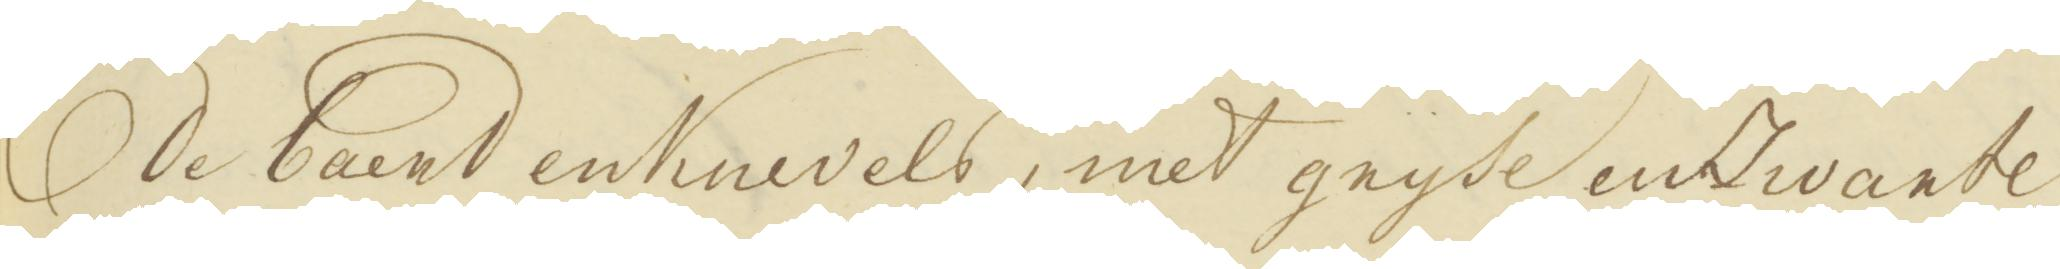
de baerd en knevels, met grijse en Zwarte
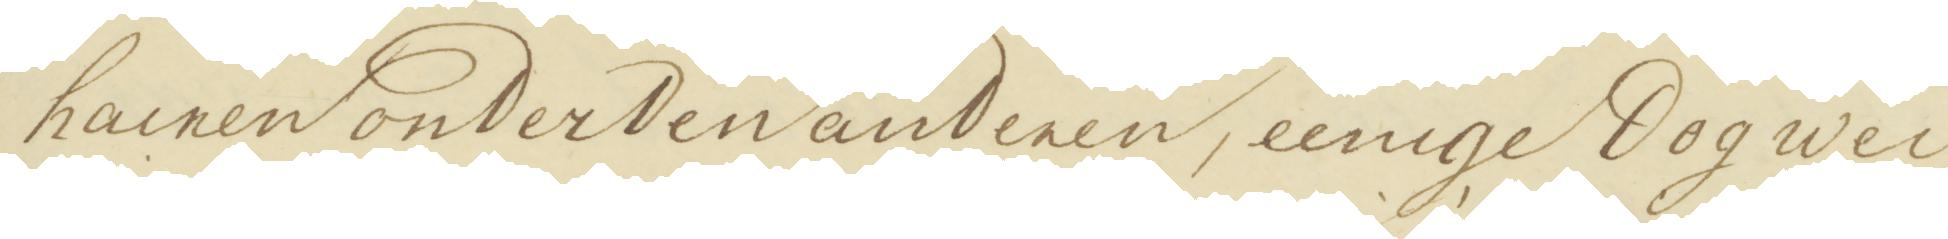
hairen onder den anderen, eenige dog wei
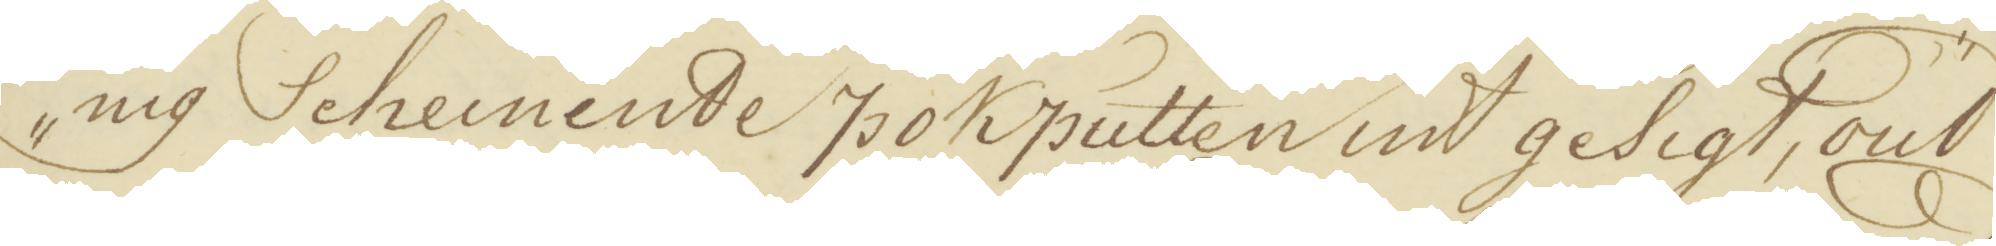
„nig Scheinende pokputten in't gesigt, oud
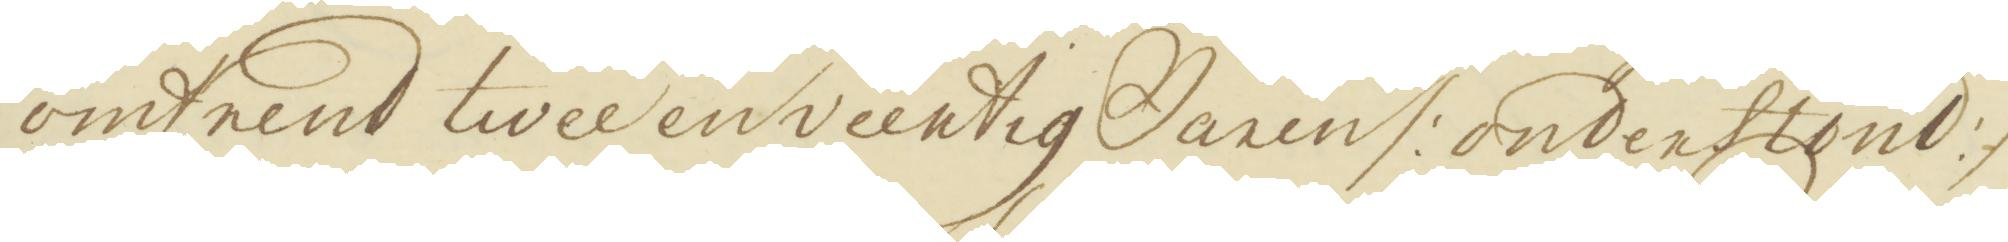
omtrend twee en veertig Iaren /:onderstond:/
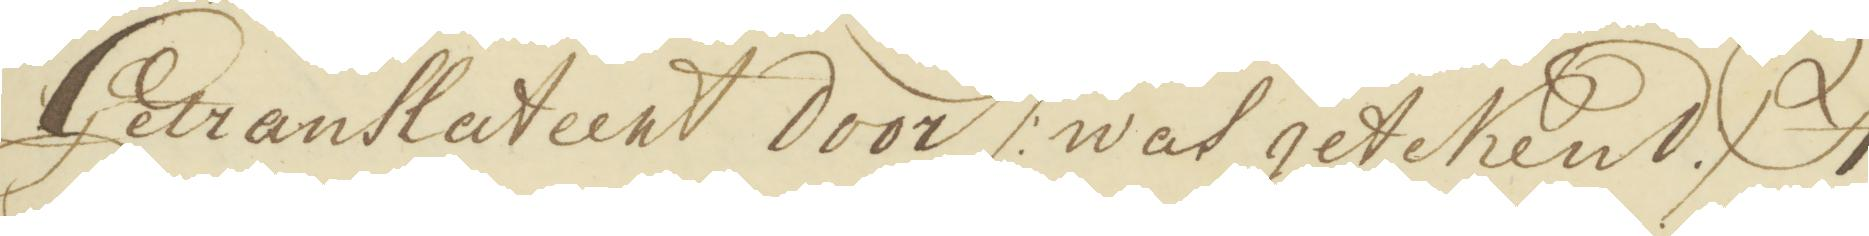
Getranslateert door /: was getekend:/ A=n
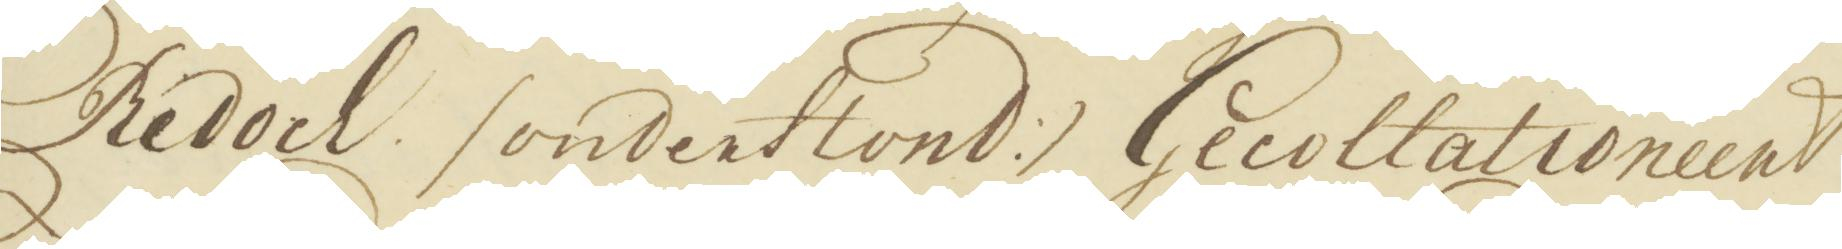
Redoch: /onderstond:/ Gecollationeert
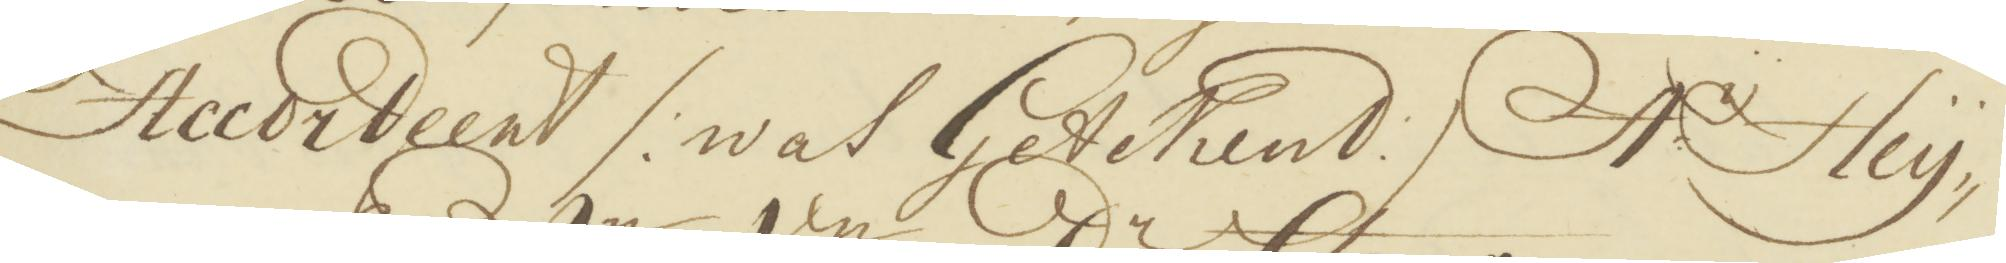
Accordeert /: was Getekend:/ A.ij Heij„
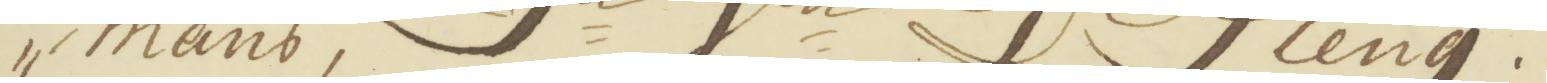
„mans, „ I„n V„n D„r Steng.
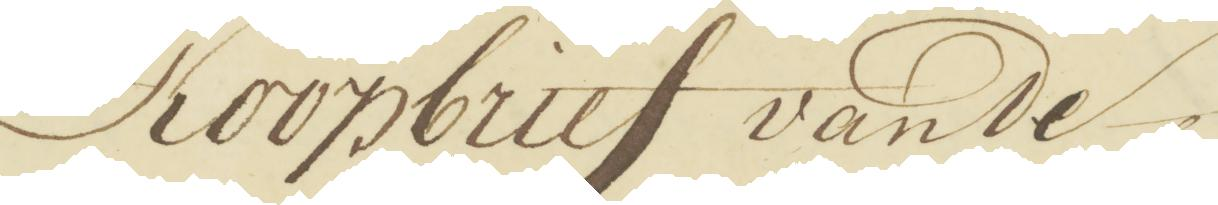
Koopbrief van de
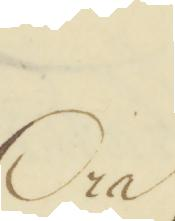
L=ra
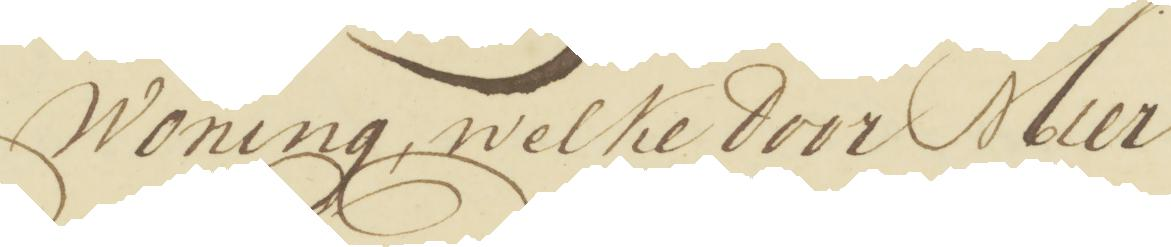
Woning, welke door Mier
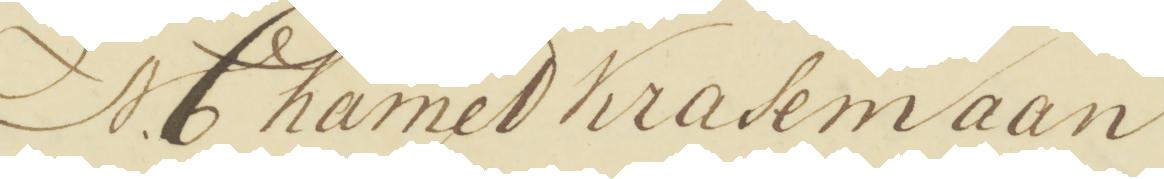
Mhamed Krasem aan
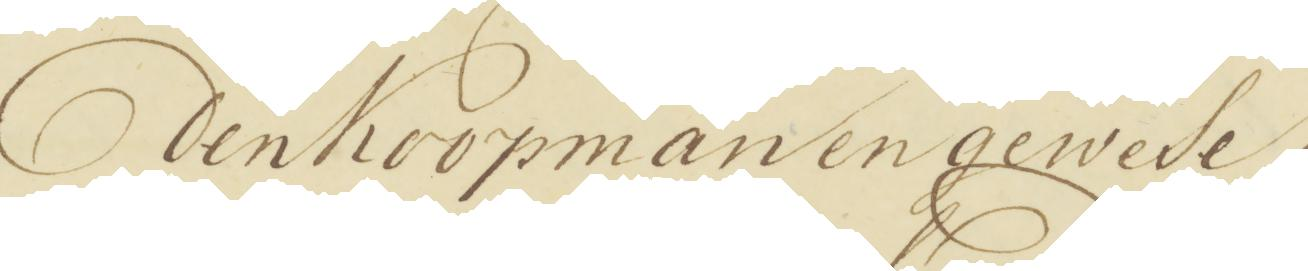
den Koopman en gewese
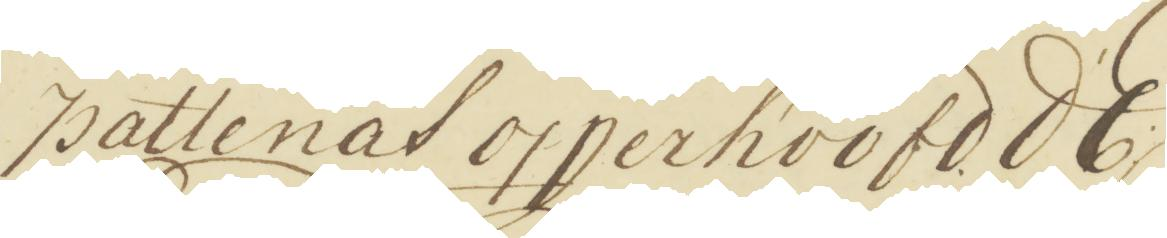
pattenas opperhoofd d'E:
